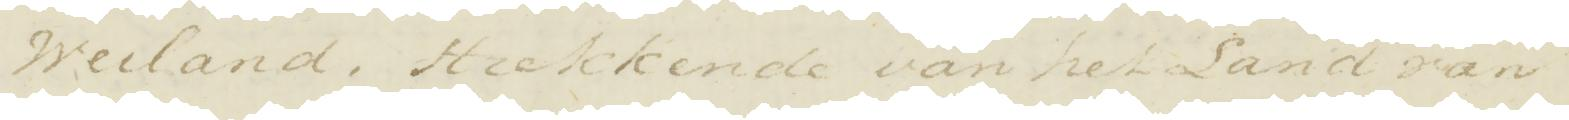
Weiland, strekkende van het Land van
